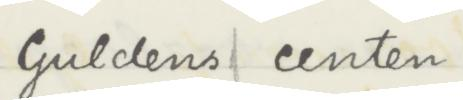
Guldens centen
